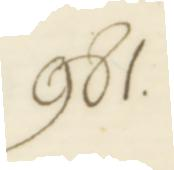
981.
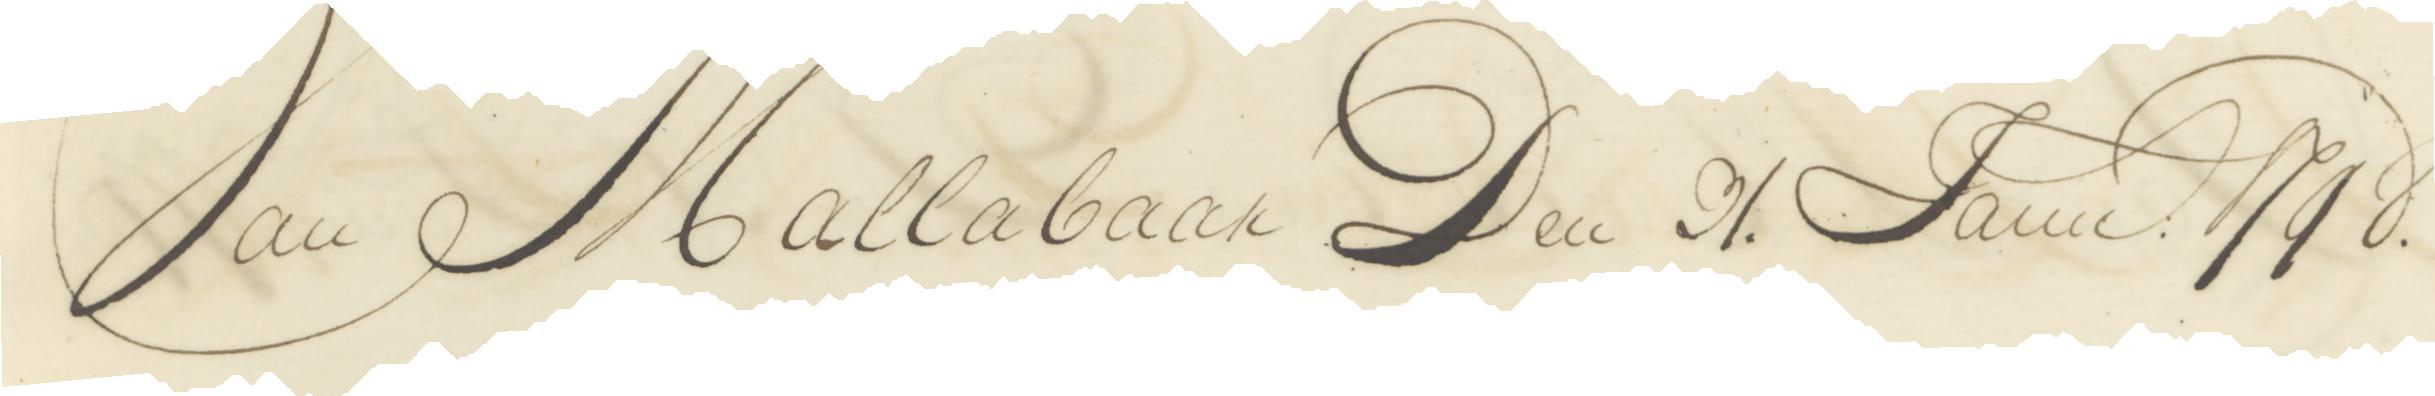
Van Mallabaar Den 31. Iann: 1748.
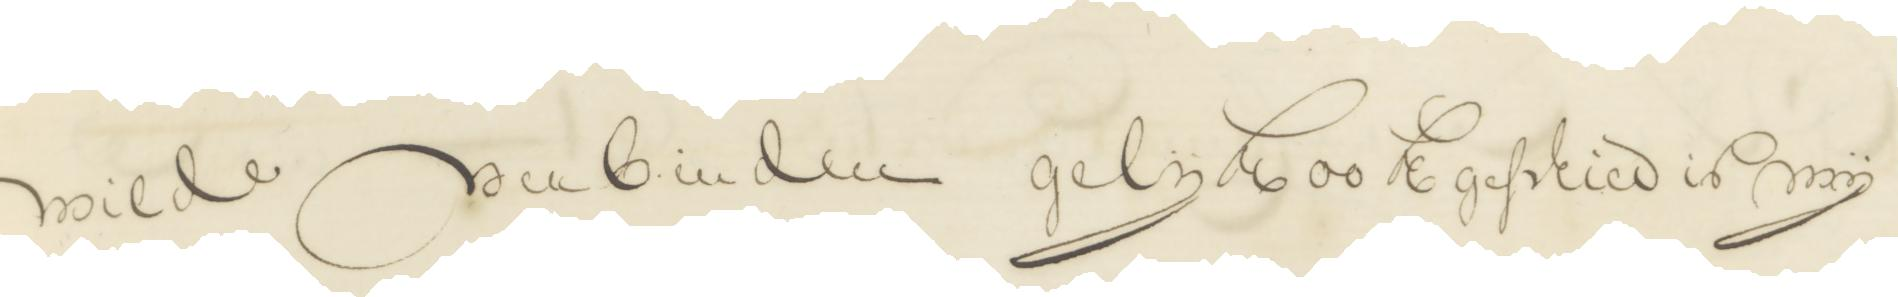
wilde verbinden gelijk ook geschied is wij
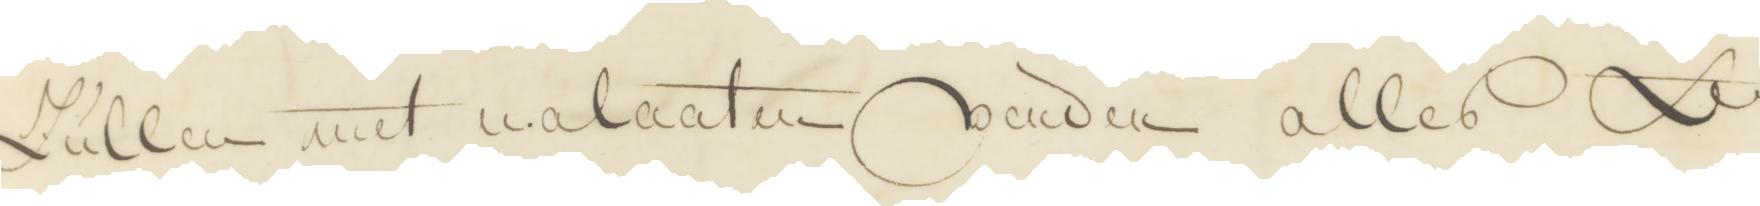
zullen niet nalaaten verder alles te
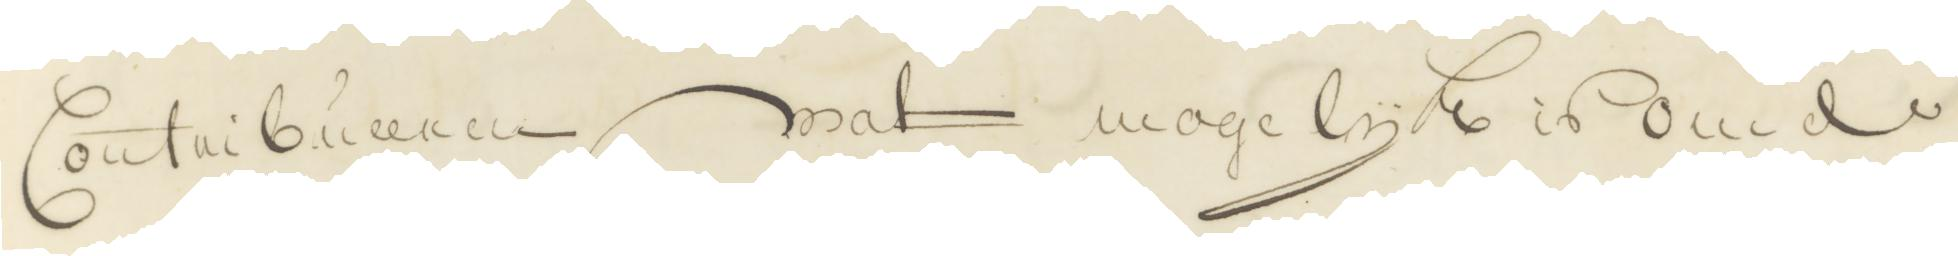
Contribueeren wat mogelijk is om de
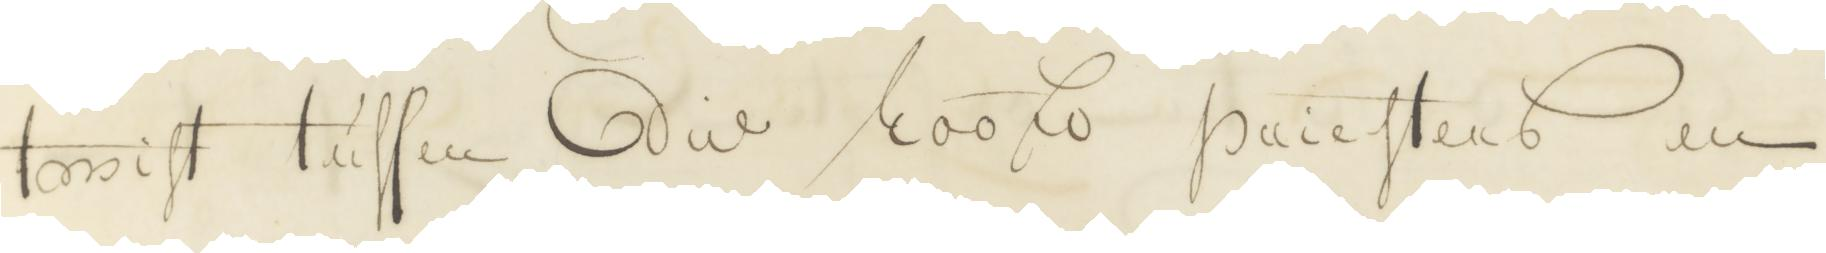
twist tussen die hoofd priesters en
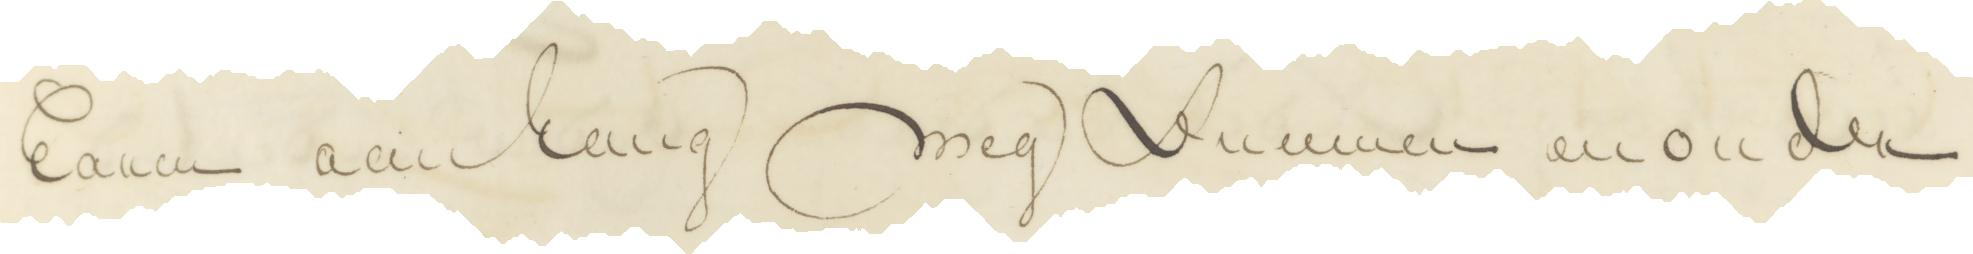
haren aanhang weg teneemen en onder
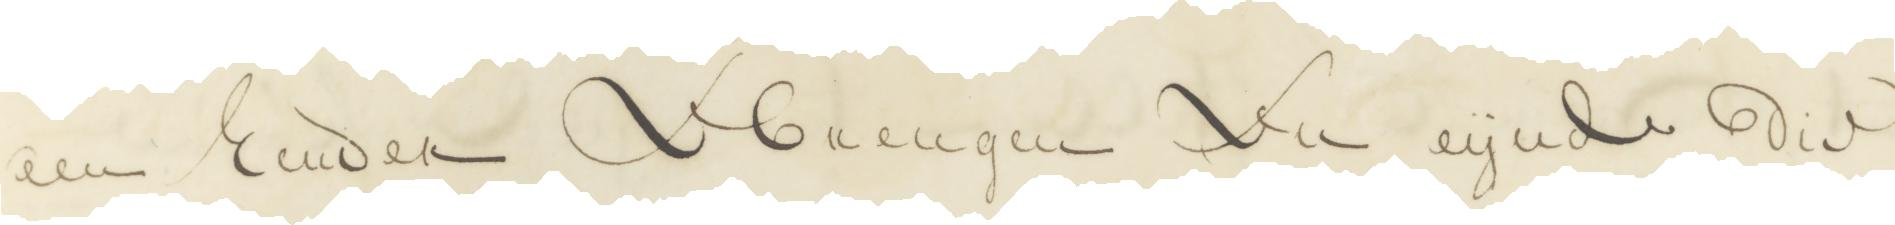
een herder tebrengen ten eijnde die
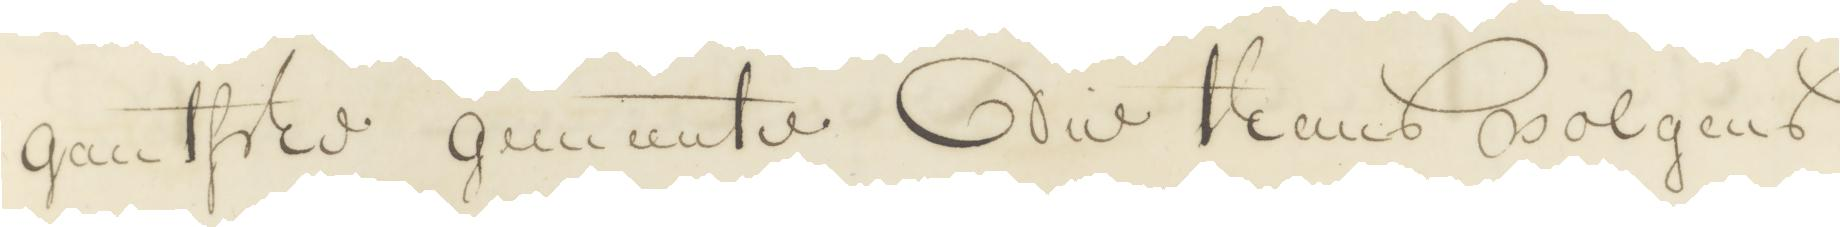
gantsche gemeente die thans volgens
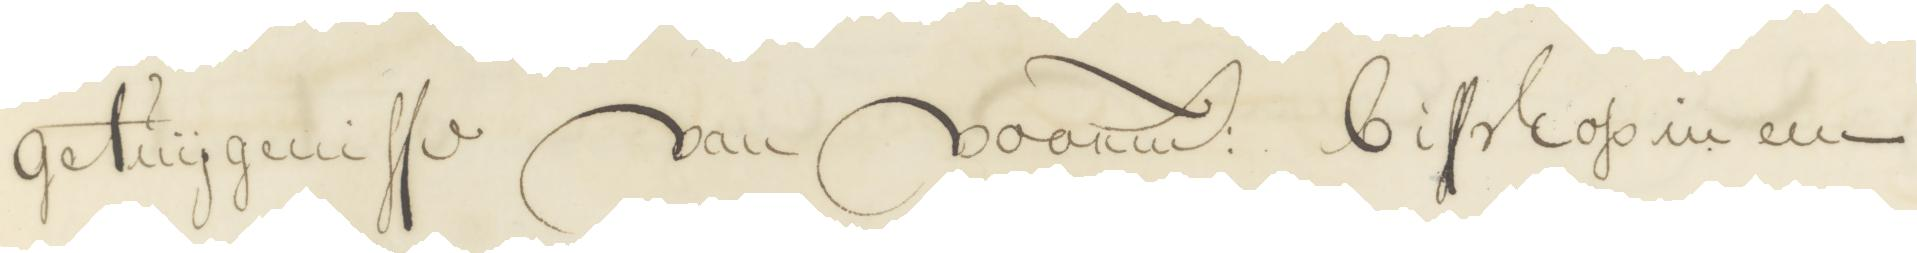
getuijgenisse van voorm: bisschop in een
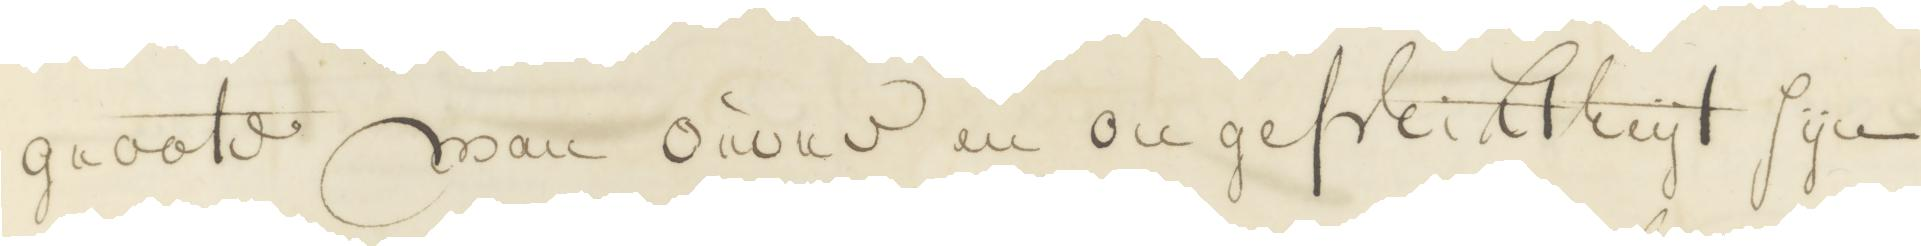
groote wan ordre en ongeschiktheijt sijn
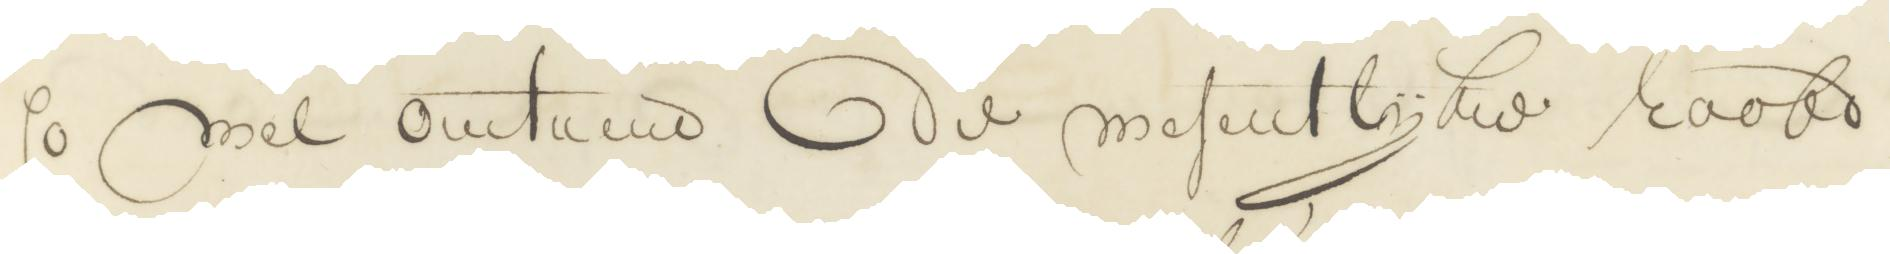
so wel omtrend de wesentlijke hoofd
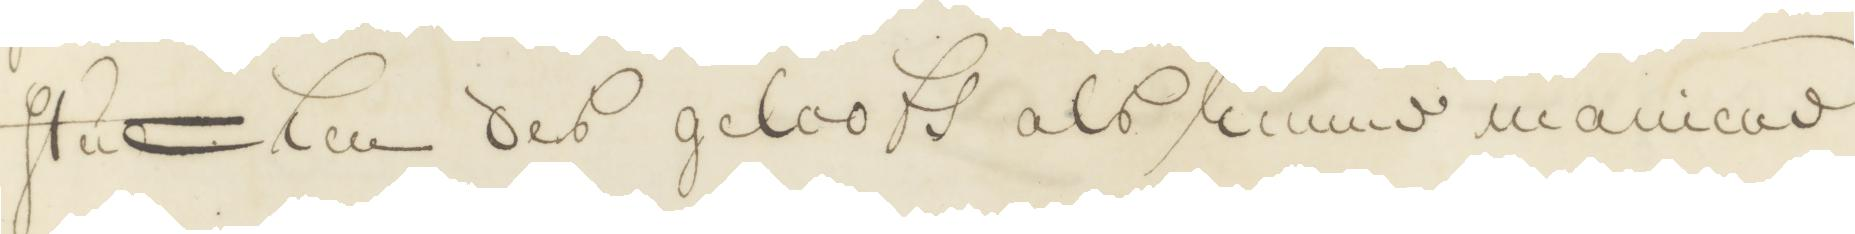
stucken des geloofs als hunne maniere
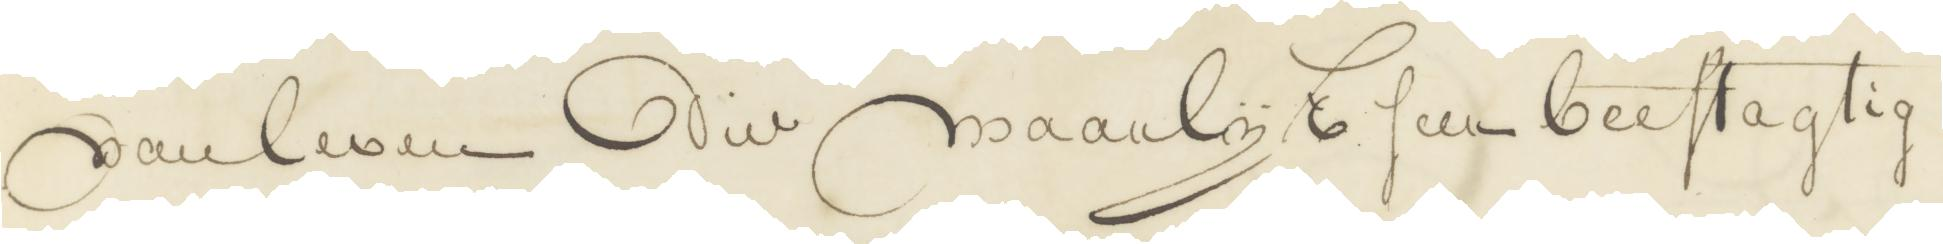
van leven die waarlijk seer beestagtig
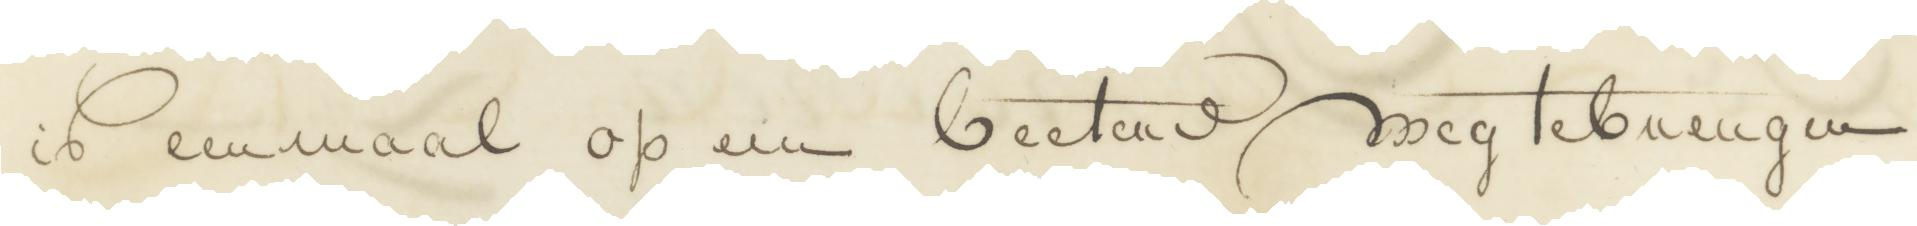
is eenmaal op een beetere weg tebrengen
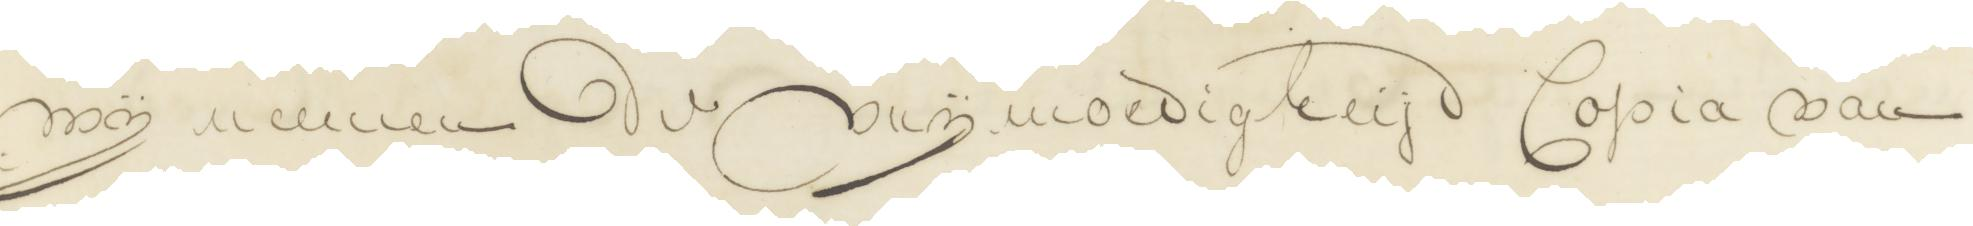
wij neemen de vrijmoedigheijd Copia van
